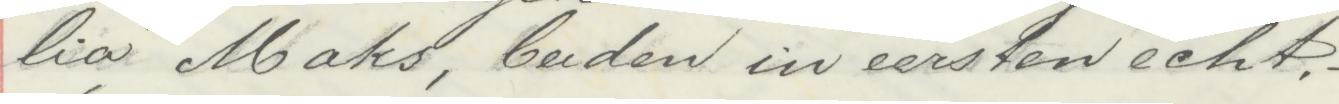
lia Maks, beiden in eersten echt,
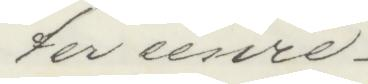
ter eenre-
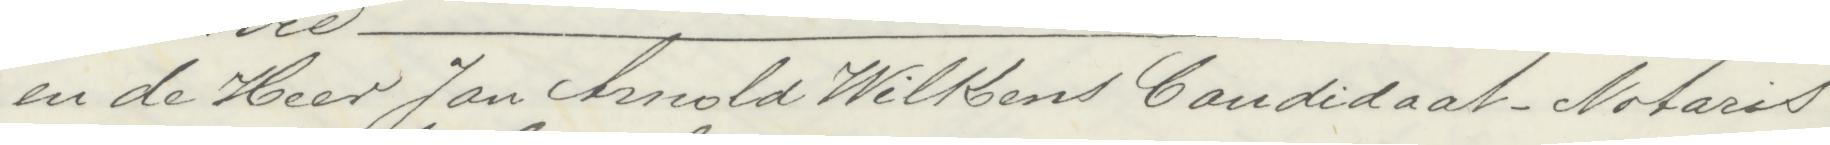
en de Heer Jan Arnold Wilkens Candidaat-Notaris
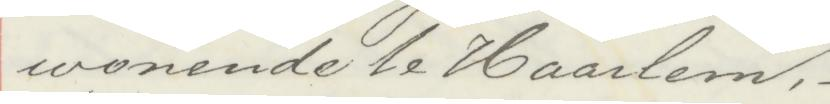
wonende te Haarlem,
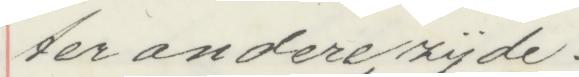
ter andere zijde
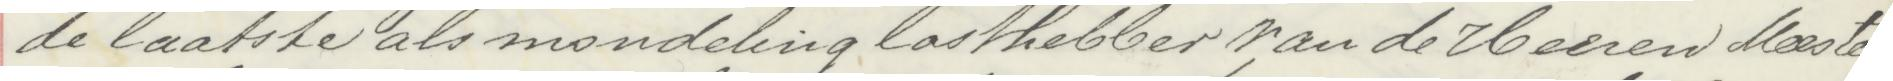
de laatste als mondeling lasthebber van de Heeren Meester
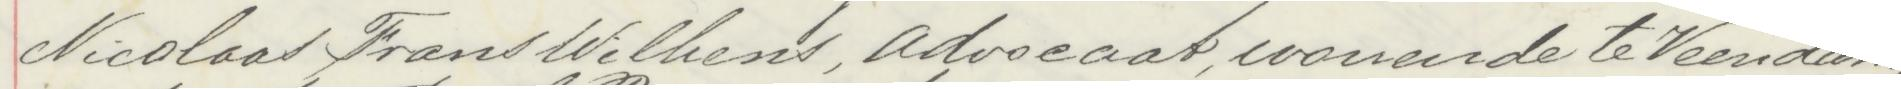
Nicolaas Frans Wilkens, Advocaat, wonende te Veendam
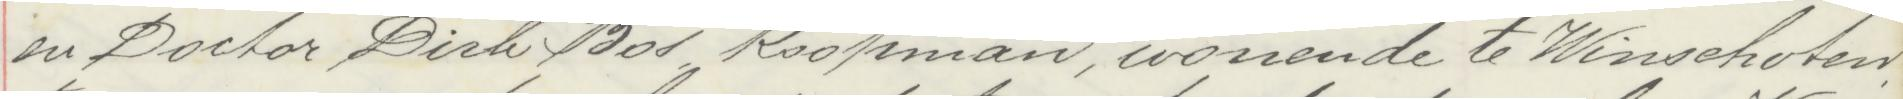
en Doctor Dirk Bos, Koopman, wonende te Winschoten,
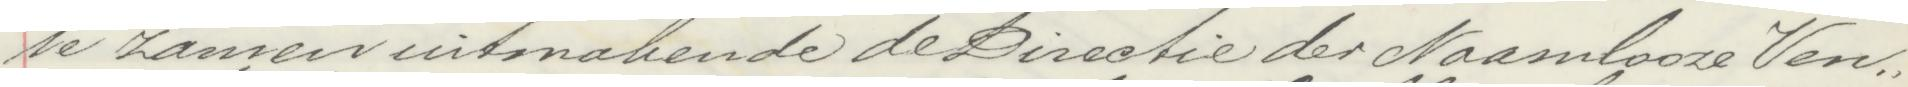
te zamen uitmakende de Directie der Naamlooze Ven„
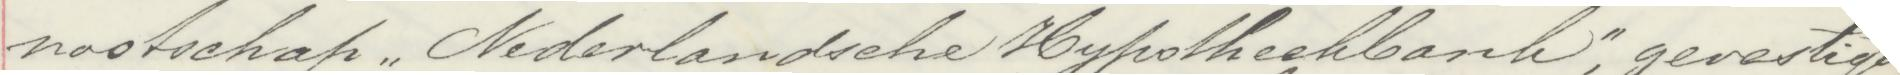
nootschap „Nederlandsche Hypotheekbank", gevestigd
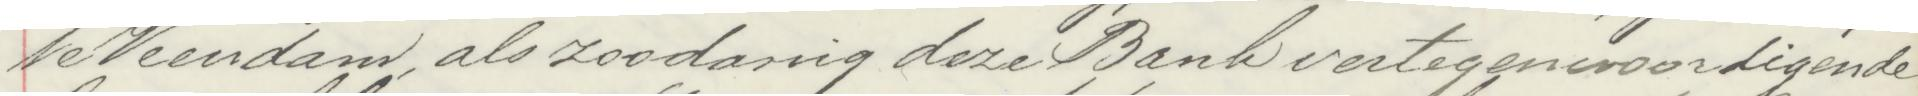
te Veendam, als zoodanig deze Bank vertegenwoordigende
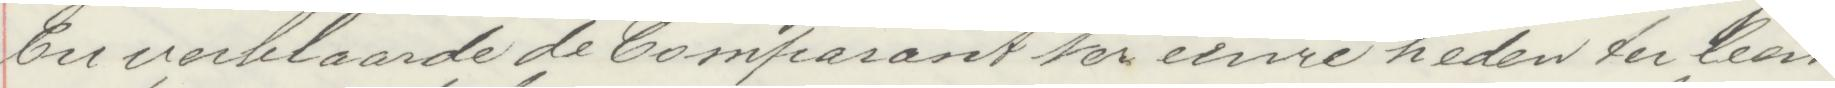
En verklaarde de Comparant ten eenre heden ter leen
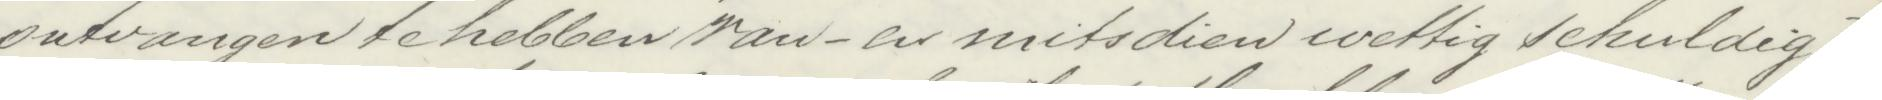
ontvangen te hebben van - en mitsdien wettig schuldig te
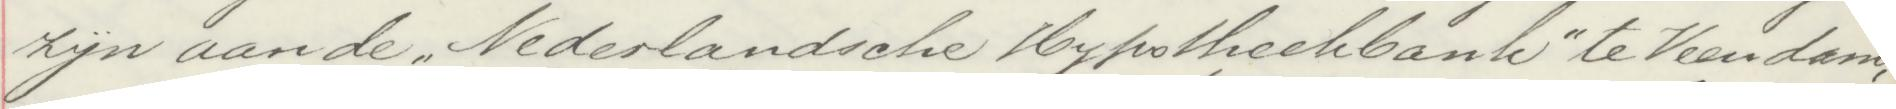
zijn aan de „Nederlandsche Hypotheekbank" te Veendam„
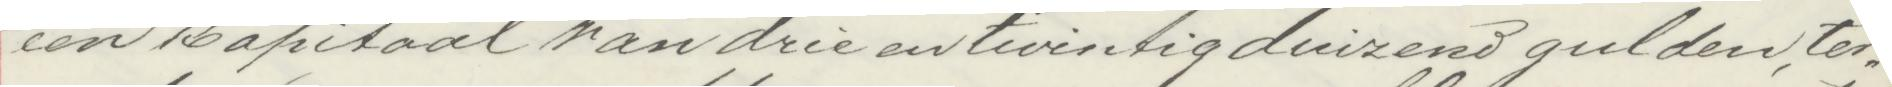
een kapitaal van drie en twintig duizend gulden ter„
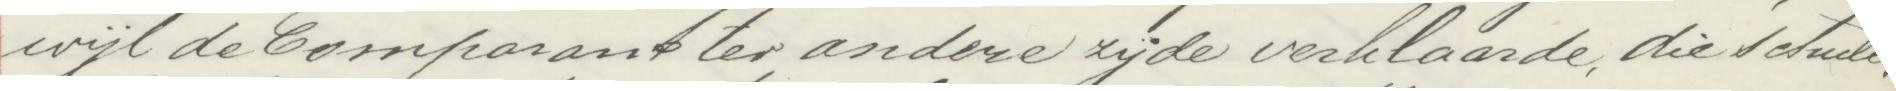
wijl de Comparant ter andere zijde verklaarde, die schuld,
